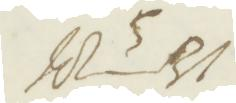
18 -5 51
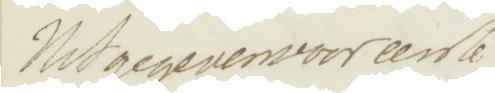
Uit gegeven voor eerste
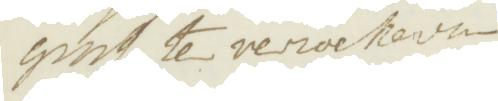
grosse ten verzoeken van
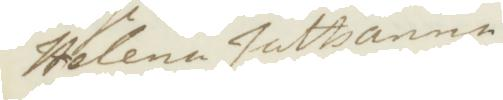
Helena Catharina
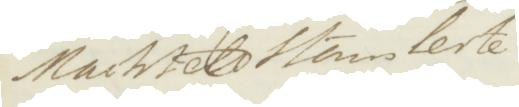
Machteld Stamler te
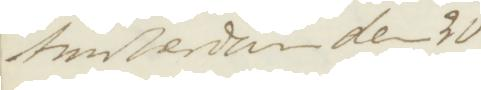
Amsterdam den 30
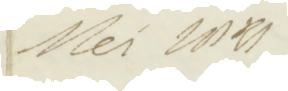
Mei 1851
